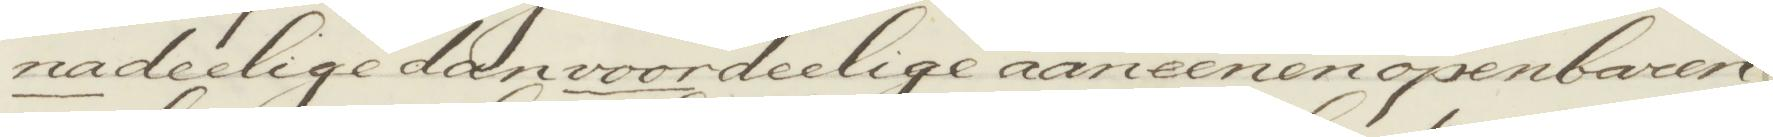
nadeelige dan voordeelige aan eenen openbaren
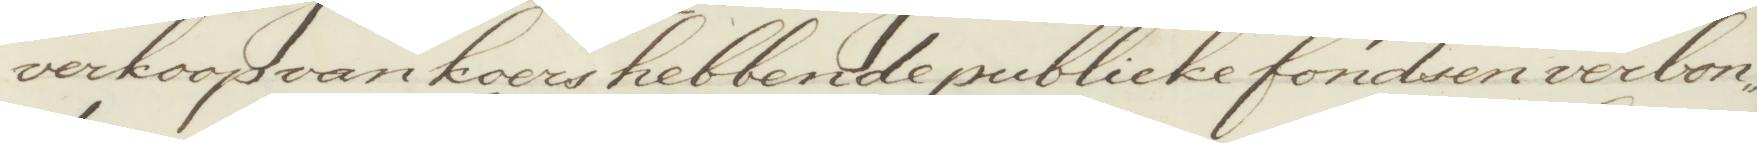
verkoop van koers hebbende publieke fondsen verbon„
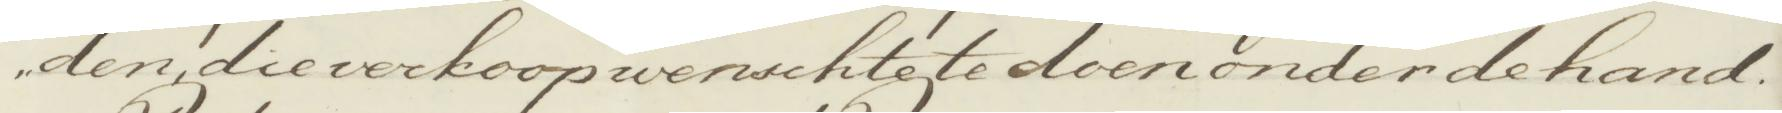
„den, die verkoop wenschte te doen onder de hand.
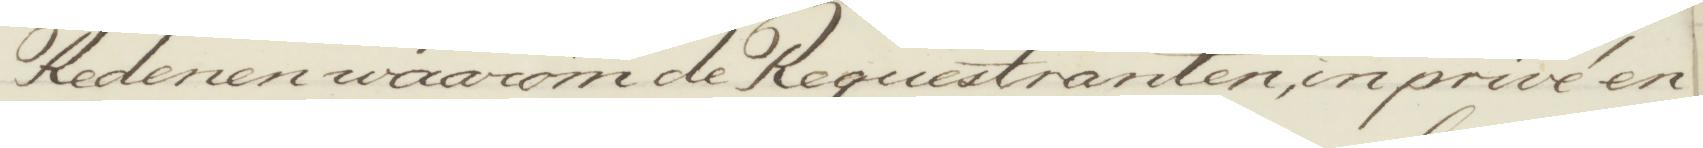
Redenen waarom de Requestranten, in privé en
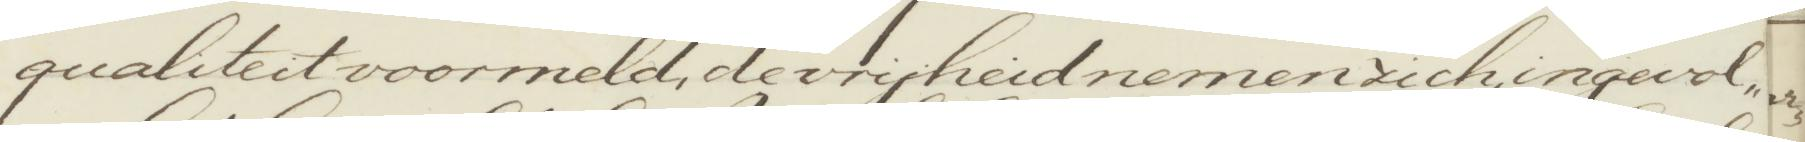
qualiteit voormeld, de vrijheid nemen zich, ingevol„
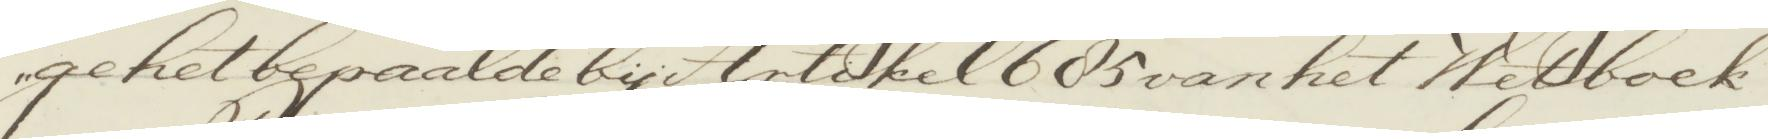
„ge het bepaalde bij Artikel 685 van het Wetboek
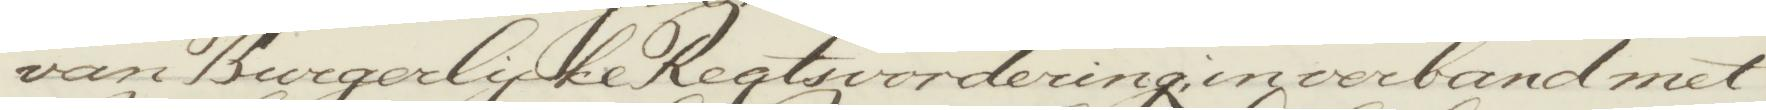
van Burgerlijke Regtsvordering, in verband met
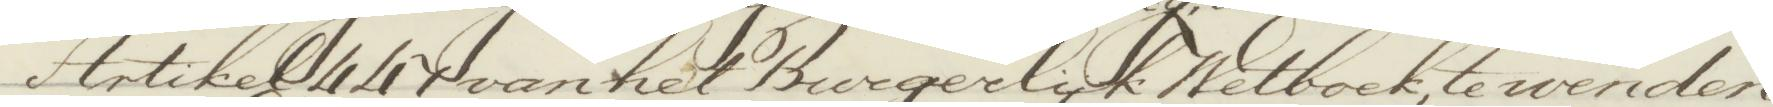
Artikel 447 van het Burgerlijk Wetboek, te wenden
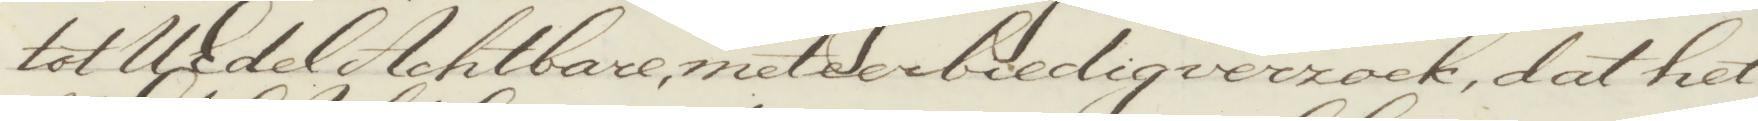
tot UEdel Achtbare, met eerbiedig verzoek, dat het
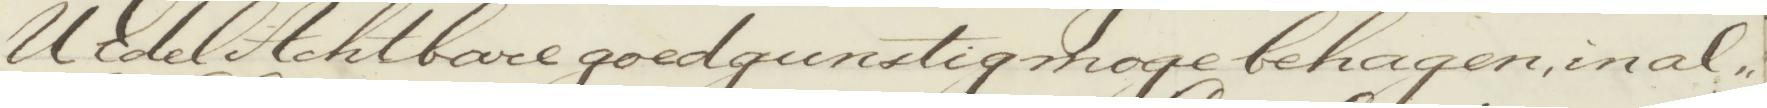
U Edel Achtbare goedgunstig moge behagen, in al„
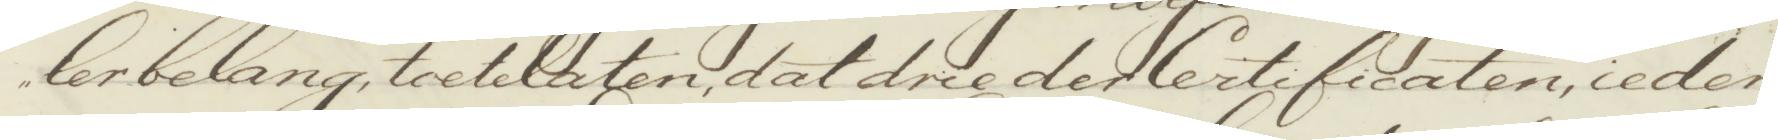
„ler belang, toetelaten, dat drie der Certificaten, ieder
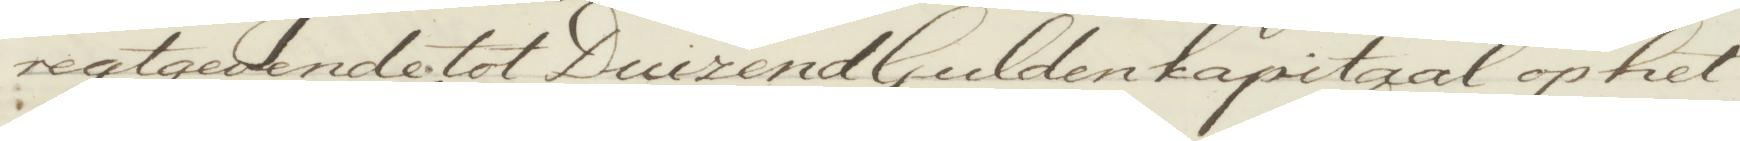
regtgevende tot Duizend Gulden kapitaal op het
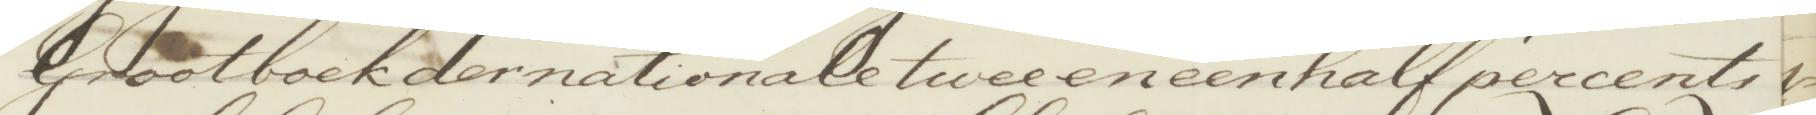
Grootboek der nationale twee en een half percents
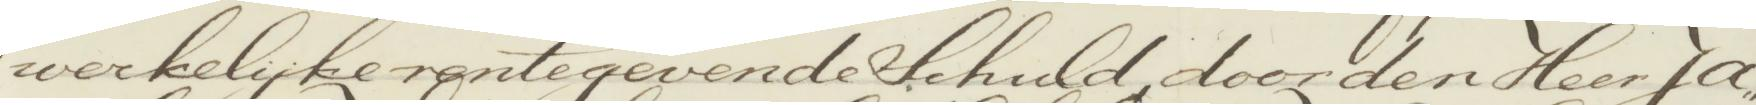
werkelijke rentegevende schuld door den Heer Ja„
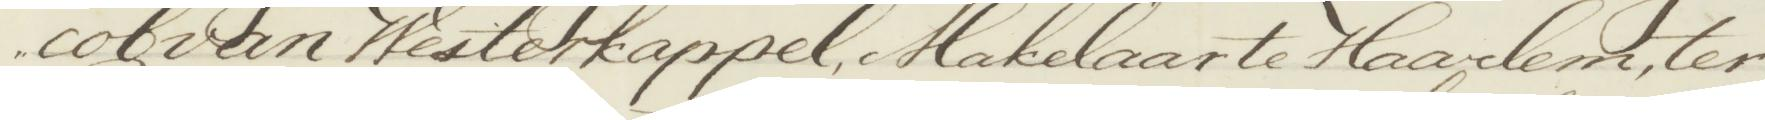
„cob van Westerkappel, Makelaar te Haarlem, ter
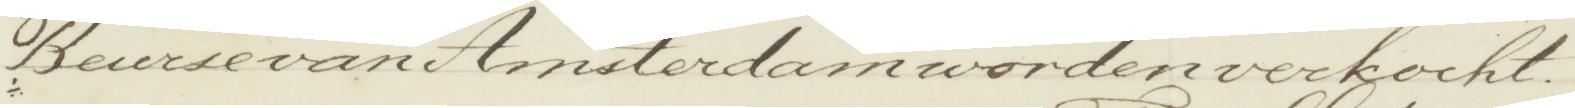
Beurse van Amsterdam worden verkocht.
